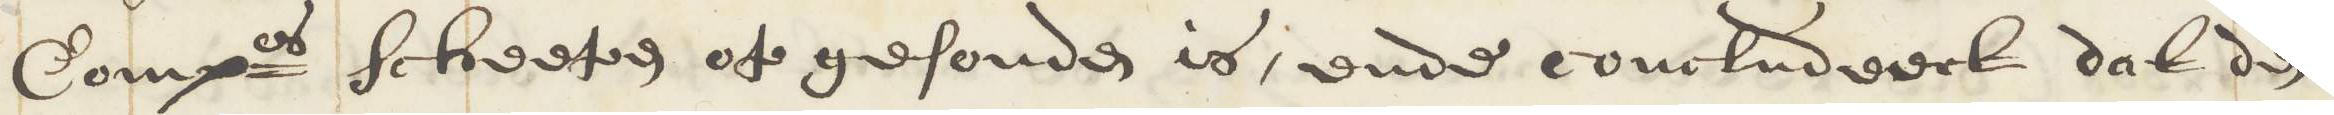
Comp=e scheepen op gesonden is, ende concludeert dat den
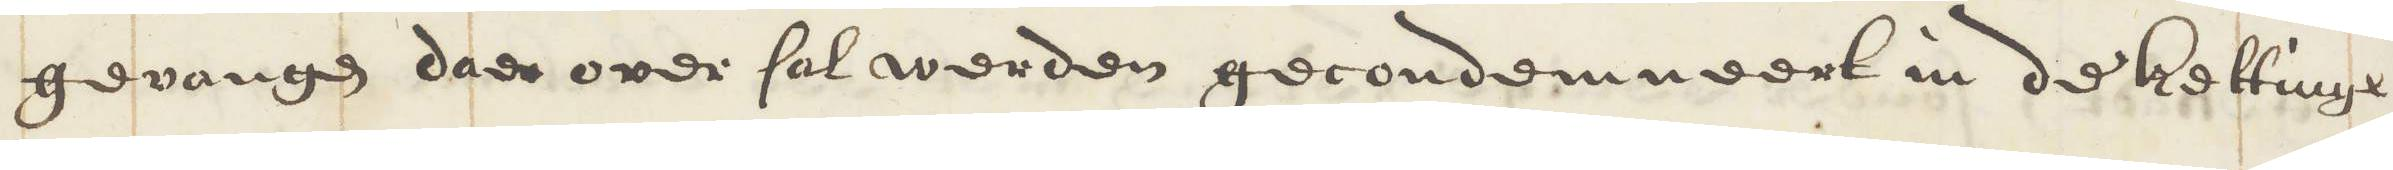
gevangen daer over sal werden gecondemneert in de kettinge
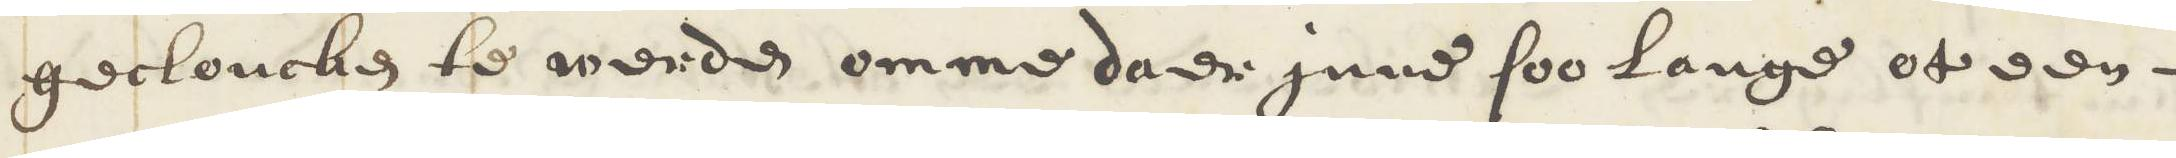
gecloncken te werden omme daer jnne soo lange op een-
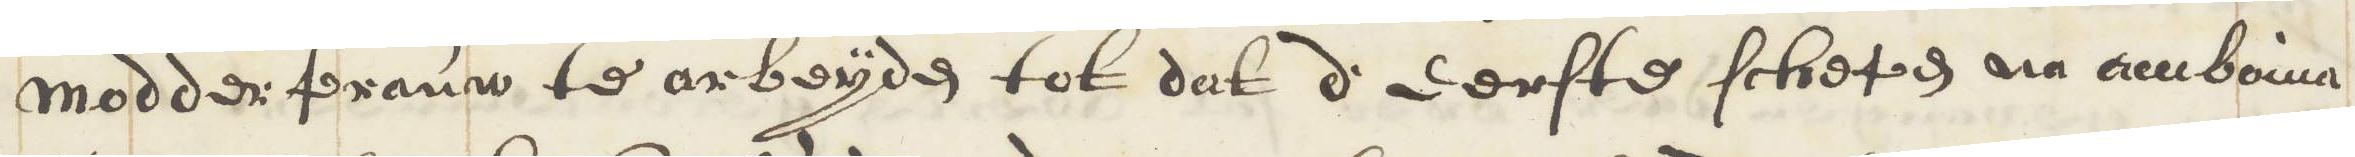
modderprauw te arbeijden tot dat d’ Eerste schepen na amboina
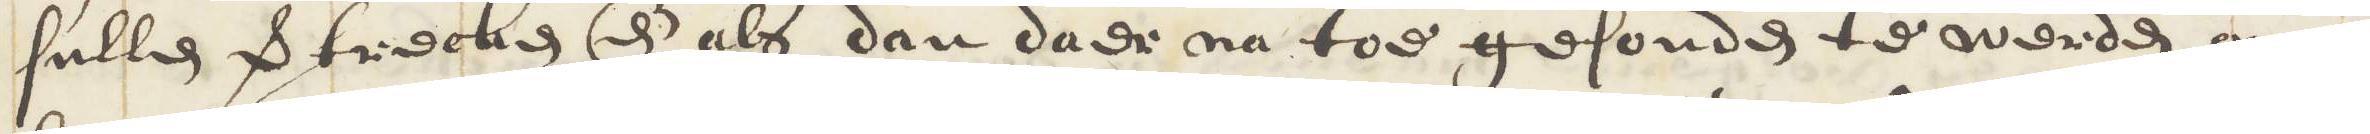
sullen vertrecken ende als dan daer na toe gesonden te werden om
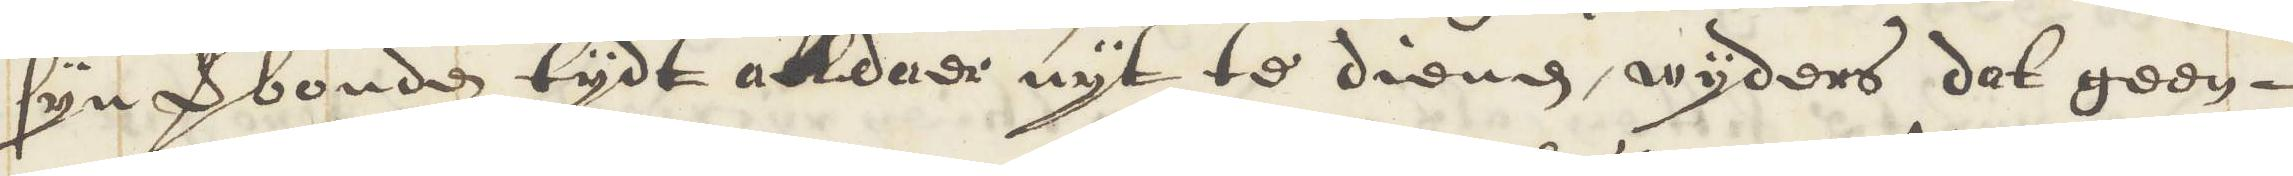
sijn verbonden tijdt aldaer uijt te dienen, wijders dat geen-
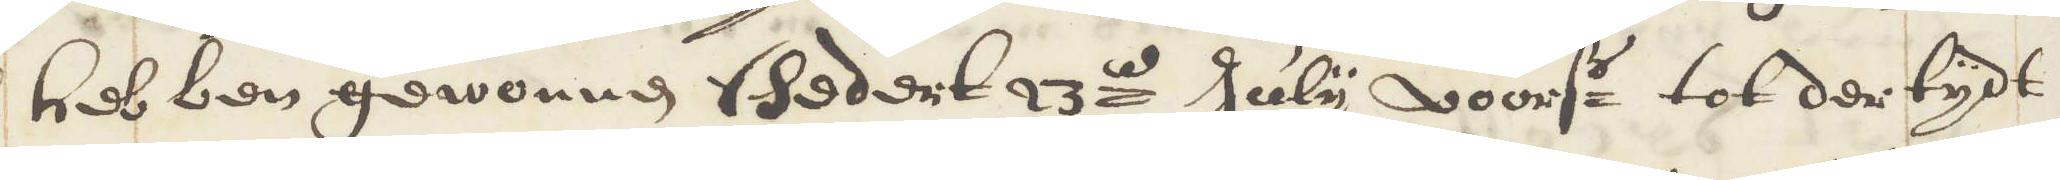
hebben gewonnen tsedert 23=e Julij voorsz tot der tijdt
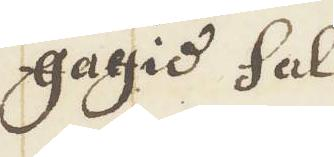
gagie sal
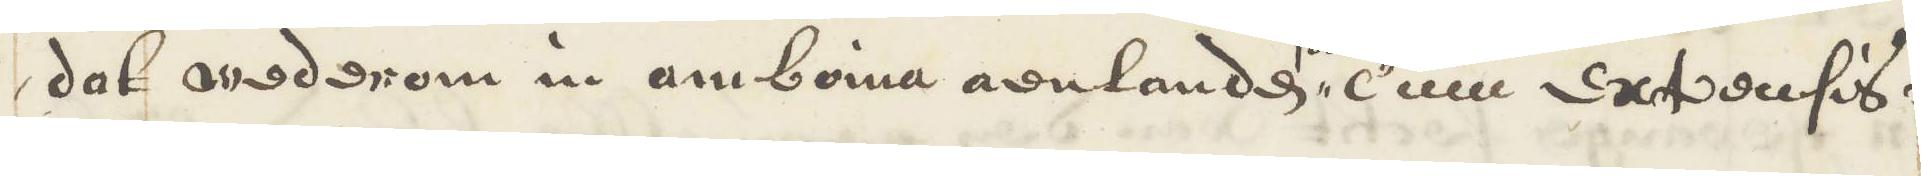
dat wederom in amboina aenlanden „sal cum expensis
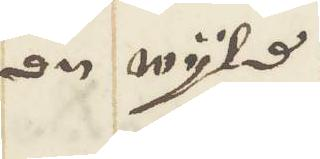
en wijle
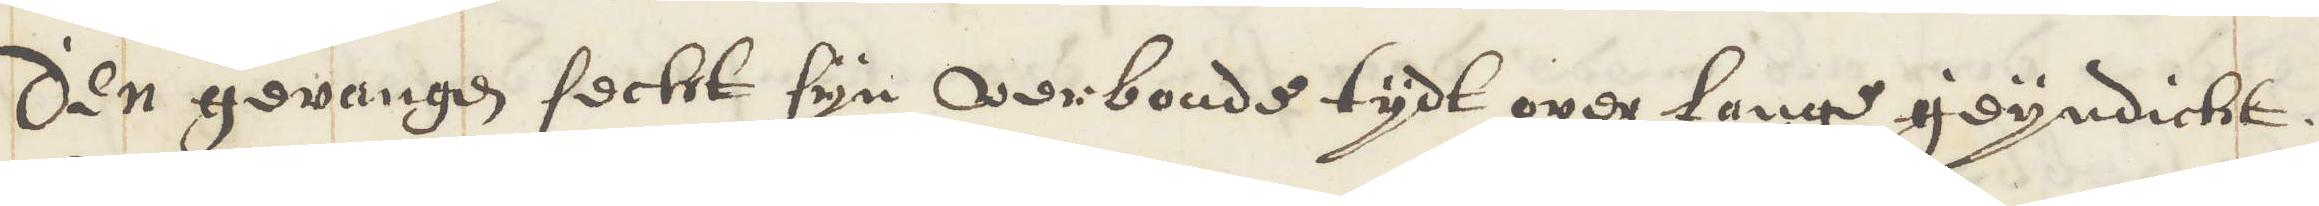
den gevangen secht sijn verbonde tijdt over lange g'eijndicht.
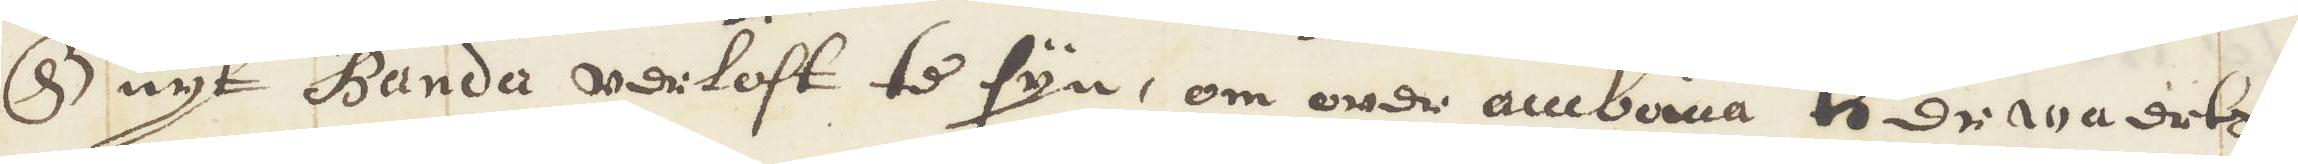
ende uijt Banda verlost te sijn, om over aimbona herwaarts
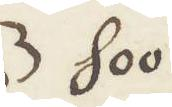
ende soo
